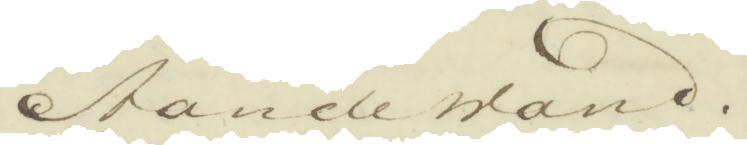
Aan de wand.
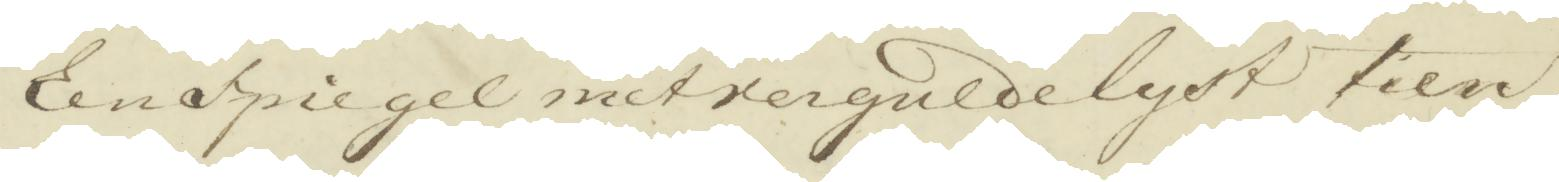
Een spiegel met vergulde lyst tien
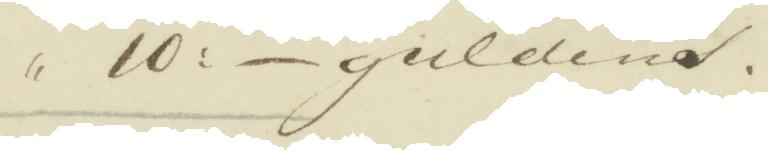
„ 10: — guldens.
